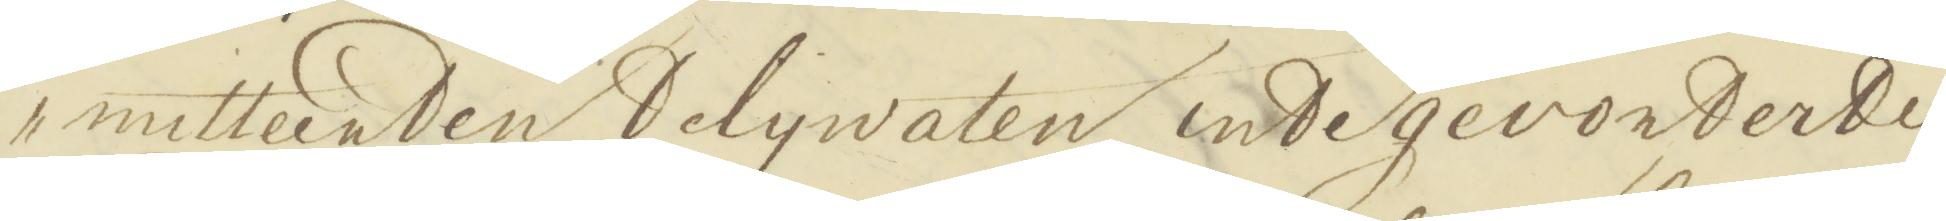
„mitteerden de lijwaten inde gevorderde
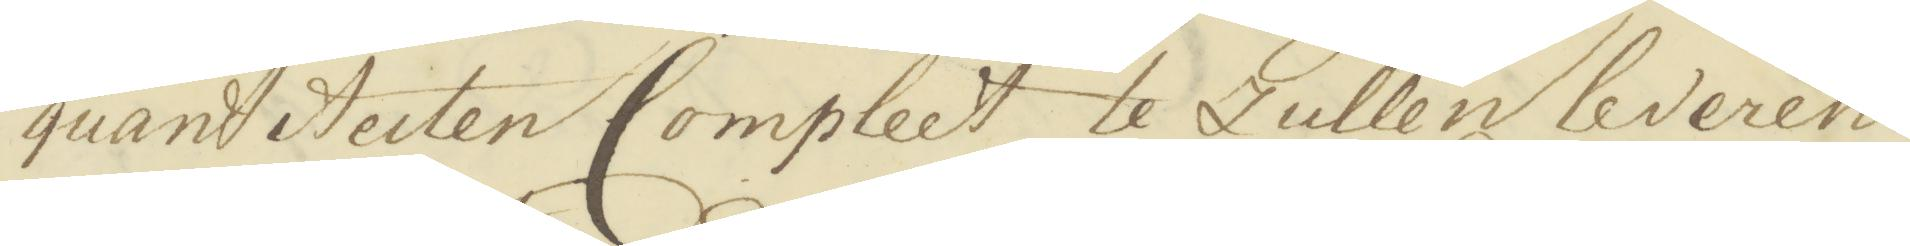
quantiteiten Compleet te zullen leveren
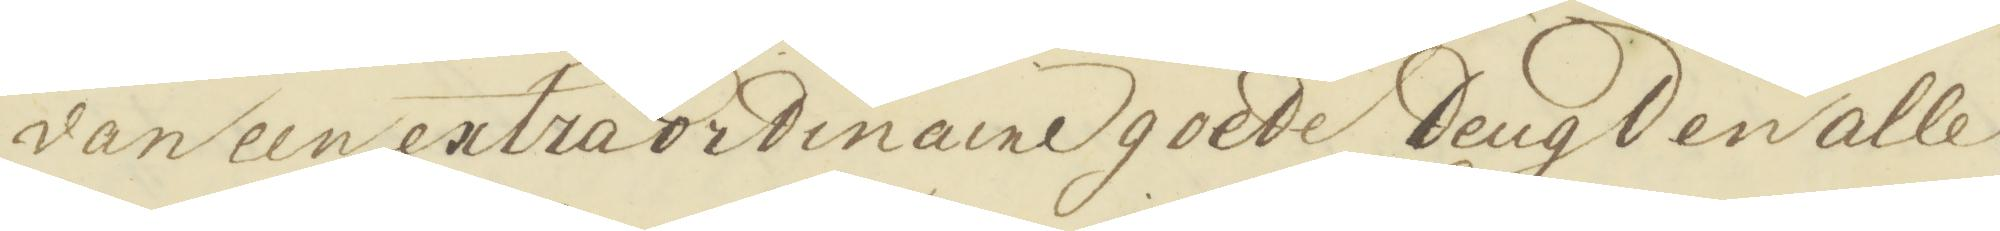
van een extraordinaire goede deugd en alle
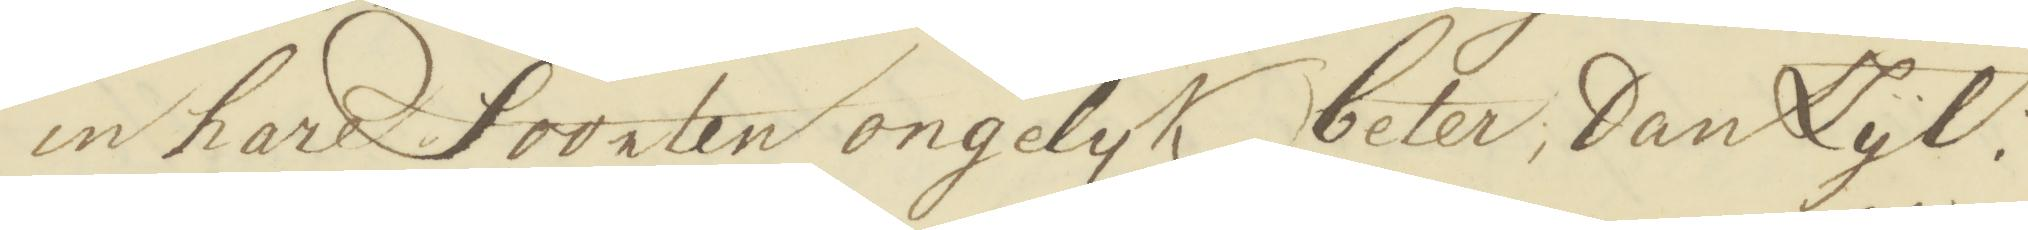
in hare Soorten ongelijk beter; dan zijl:
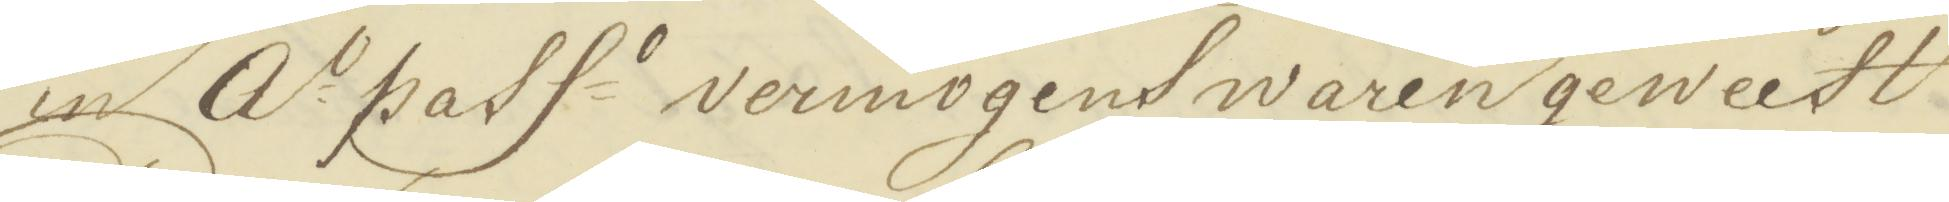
in A=o pass=o vermogens waren geweest
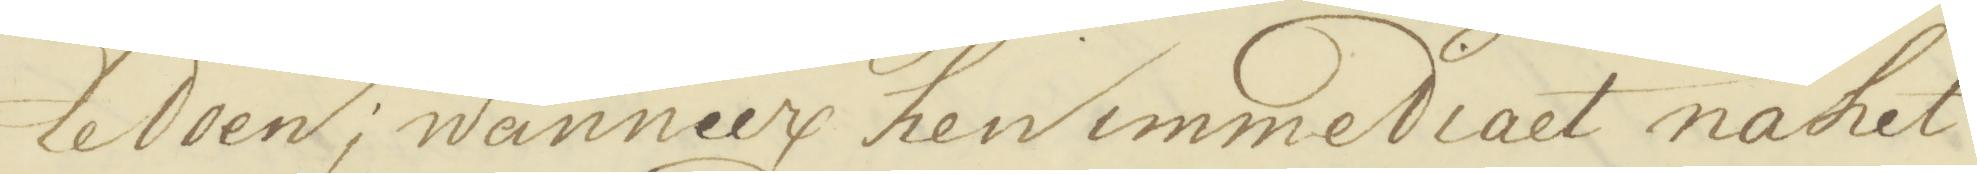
te doen; wanneer hen immediaet na het
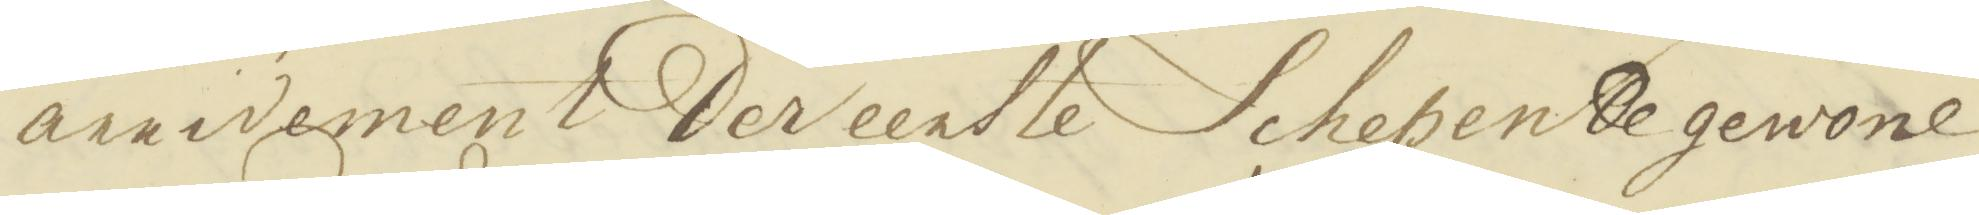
arrivement der eerste Schepen de gewone
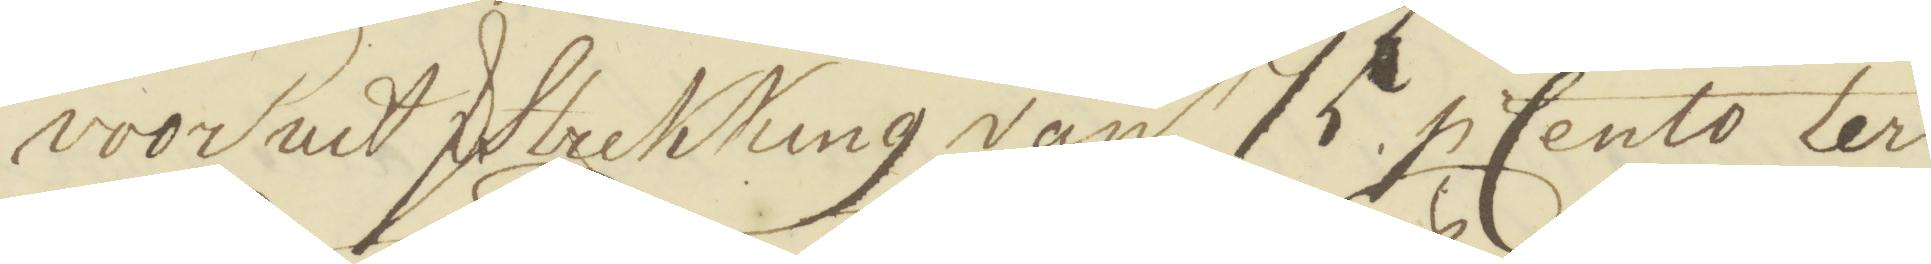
voor uit verstrekking van 75. pCento ter
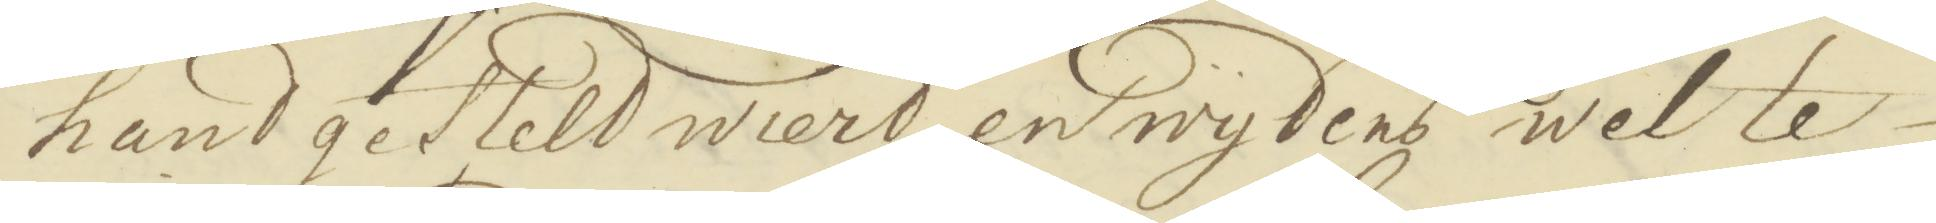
hand gesteld wierd, en wijders wel te
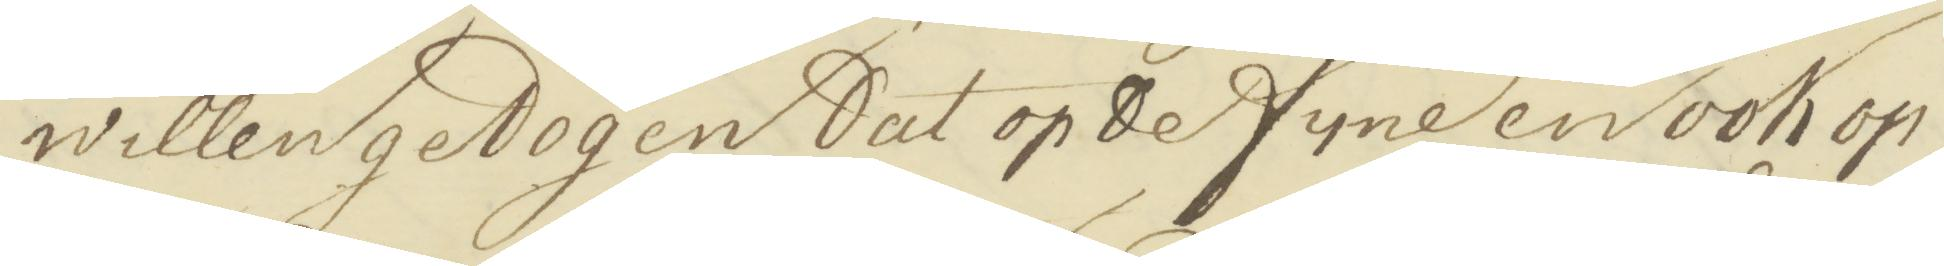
willen gedogen dat op de fijne en ook op
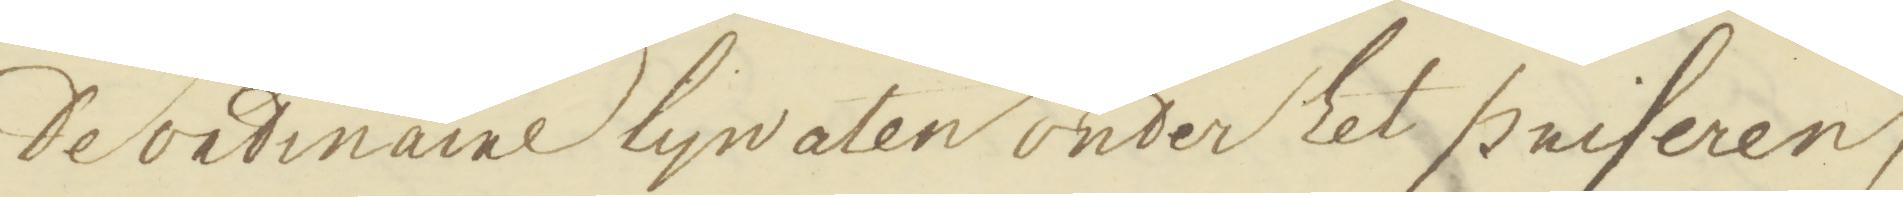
de ordinaire lijwaten onder het priseren,
